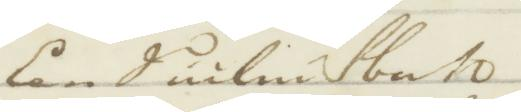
Een Vuilnisbak
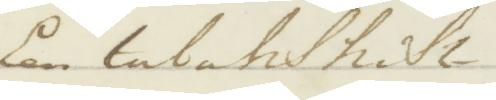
Een tabakskist
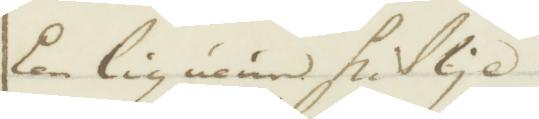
Een liqueur kistje
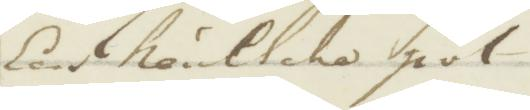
Een keulsche pot
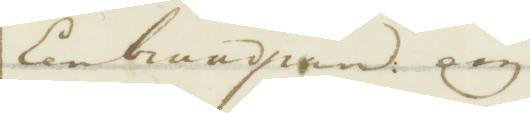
Een braadpan enz
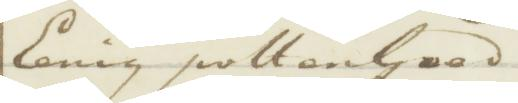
Eenig potten Goed
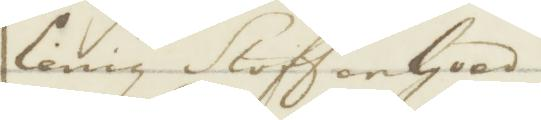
Eenig stoffen Goed
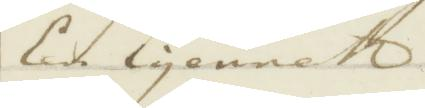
Een Eijernet
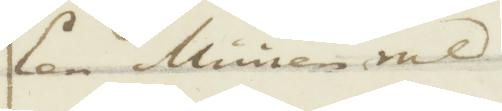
Een Muser enz
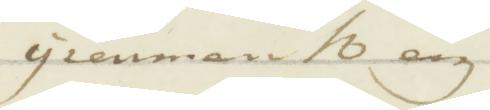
ijzerwerk enz
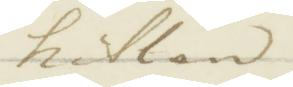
kisten
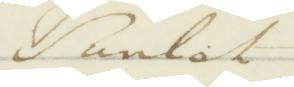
Sarlat
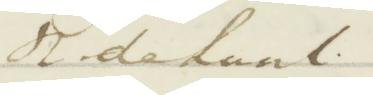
N de laat.
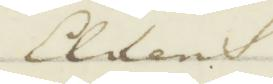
Eldens
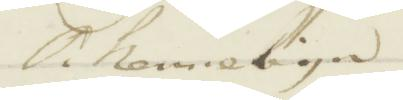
P Hermelijn
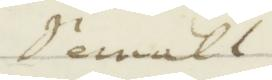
Verwalt
